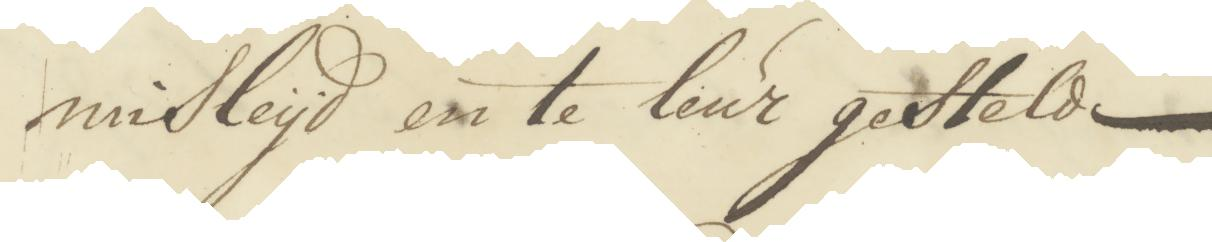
misleijd en te leur gesteld —
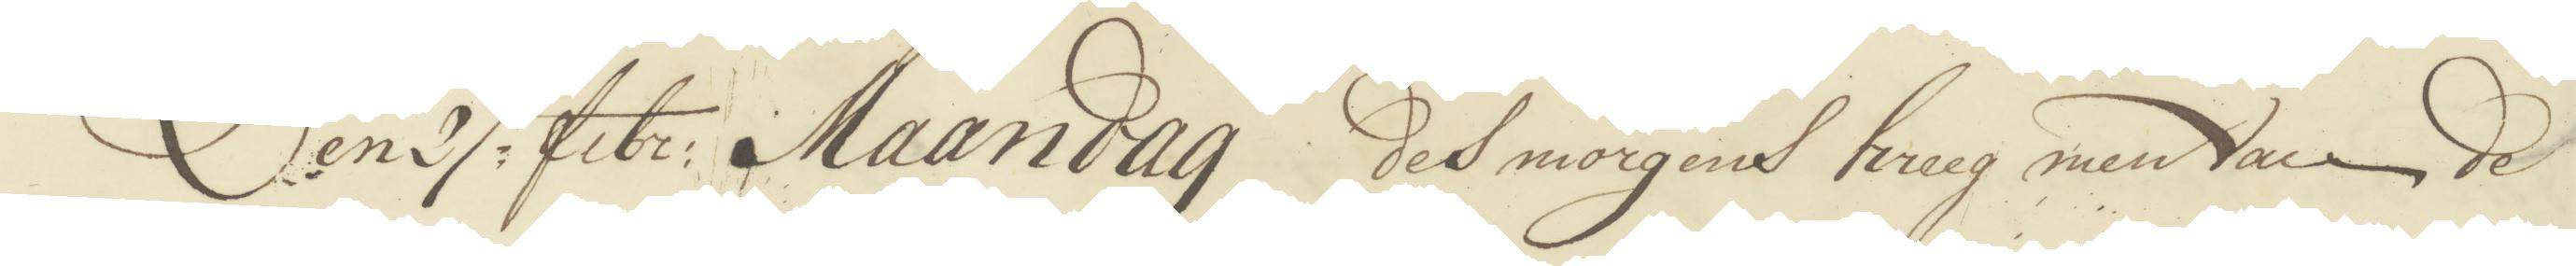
Den 27: febr: Maandag des morgens kreeg men van de
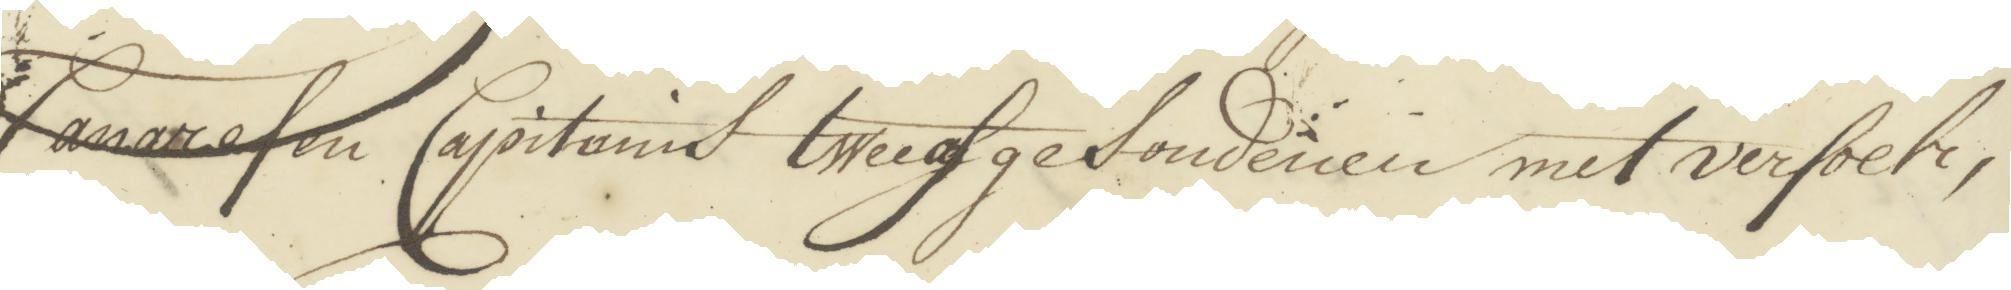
Canaresen Capitains twee af gesondenen met versoek,
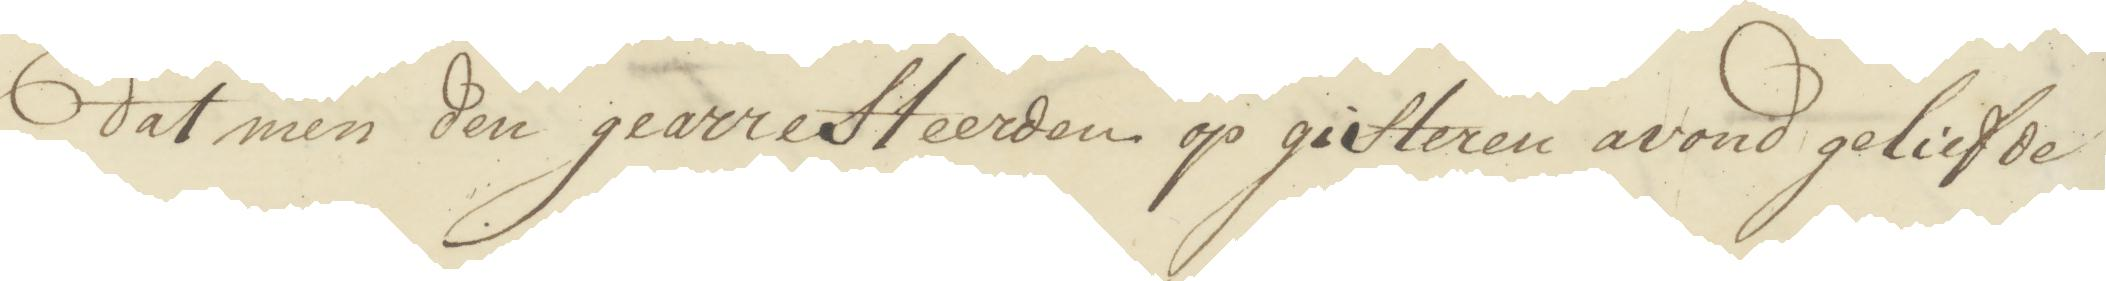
dat men den gearresteerden op gisteren avond geliefde
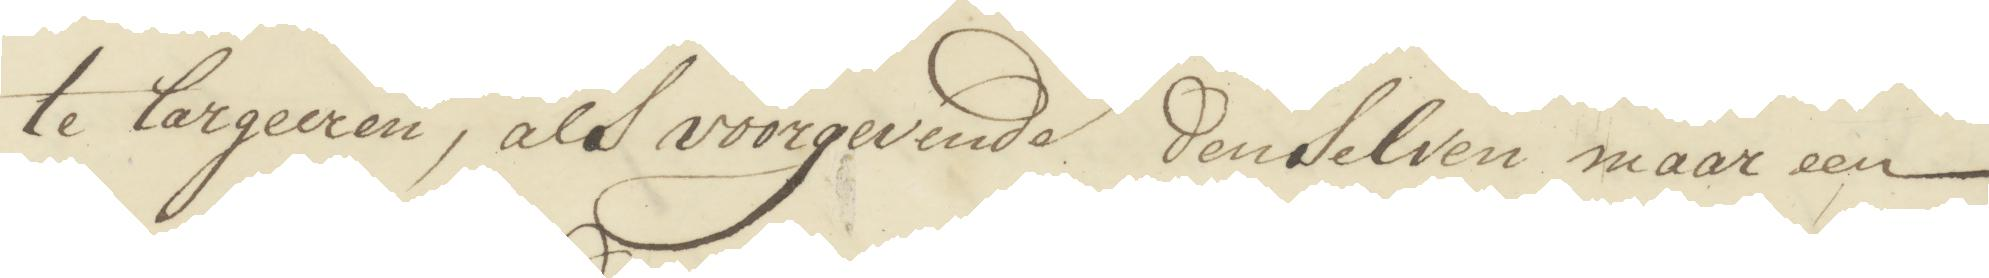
te largeeren, als voorgevende denselven maar een
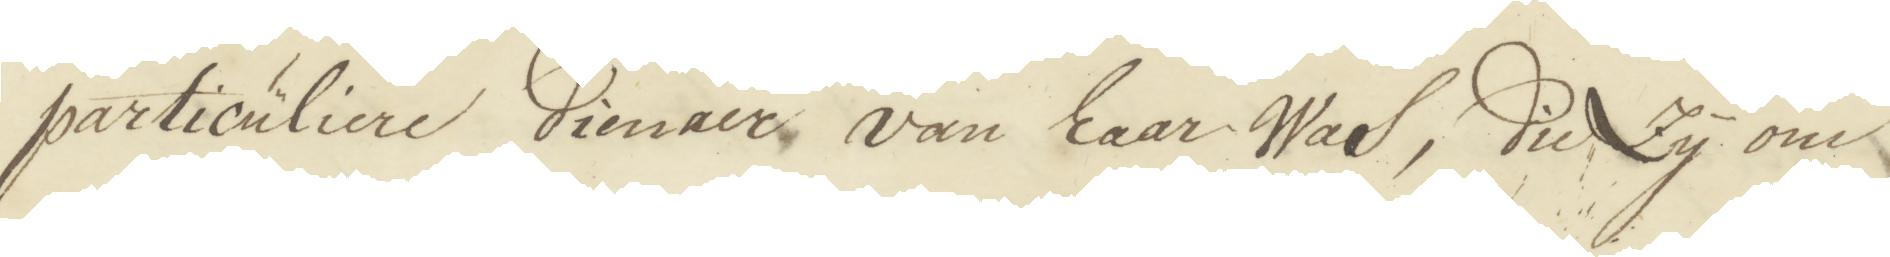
particuliere dienaer van haar was, die zij om
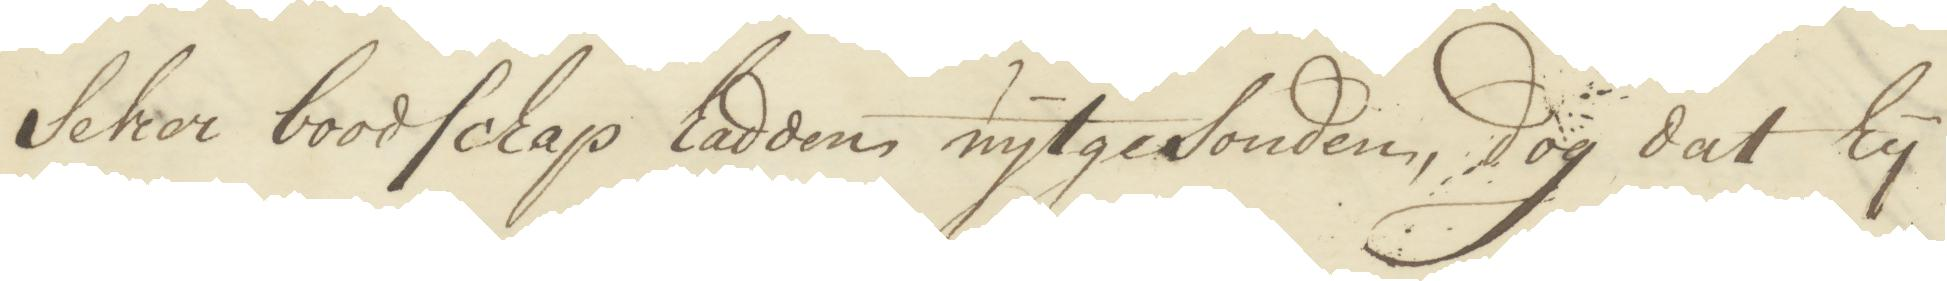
seker boodschap hadden uijtgesonden, dog dat hij
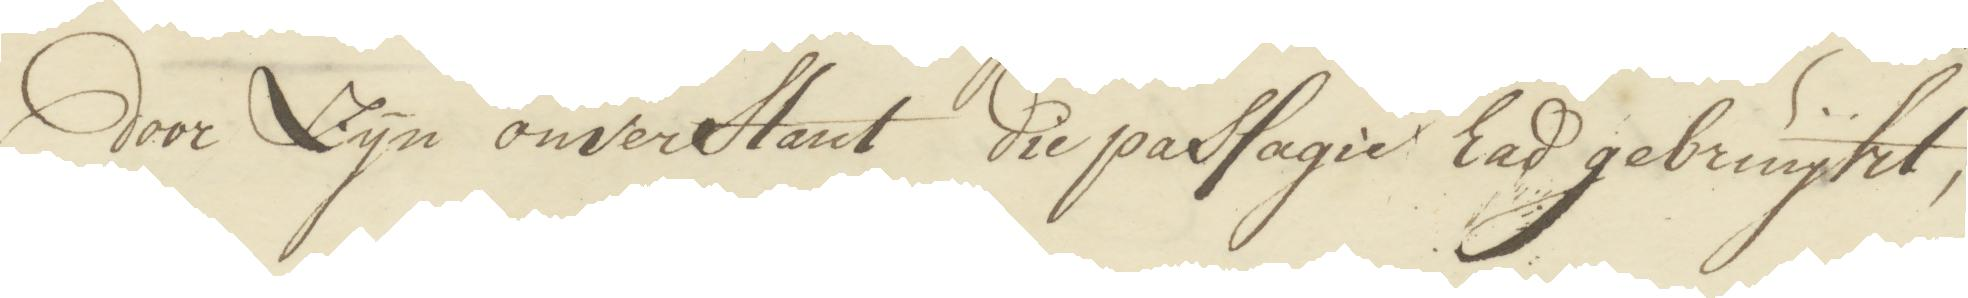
door zijn onverstant die passagie had gebruijkt,
